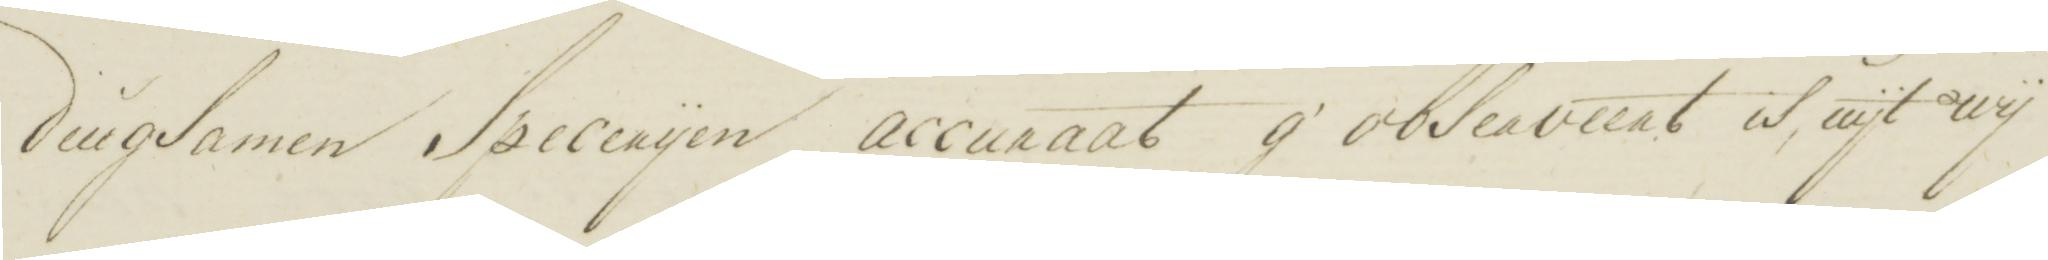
duigsamen specerijen accuraat g’observeert is, uijt wij
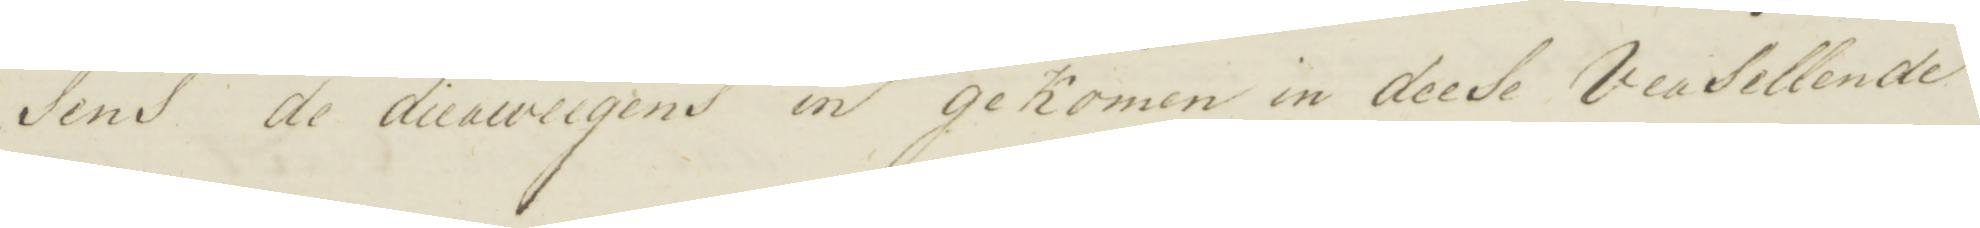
sens de dierweegens in gekomen in deese versellende
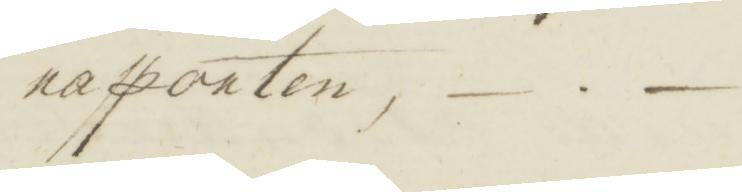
rapporten, — . —
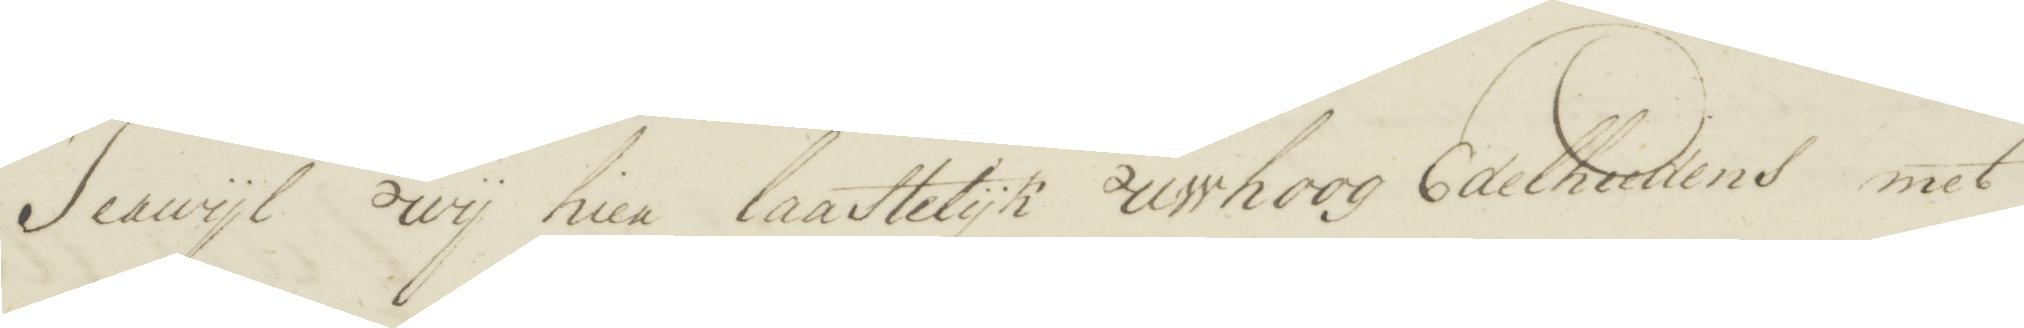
Terwijl wij hier laastelijk uwhoog Edelheedens met
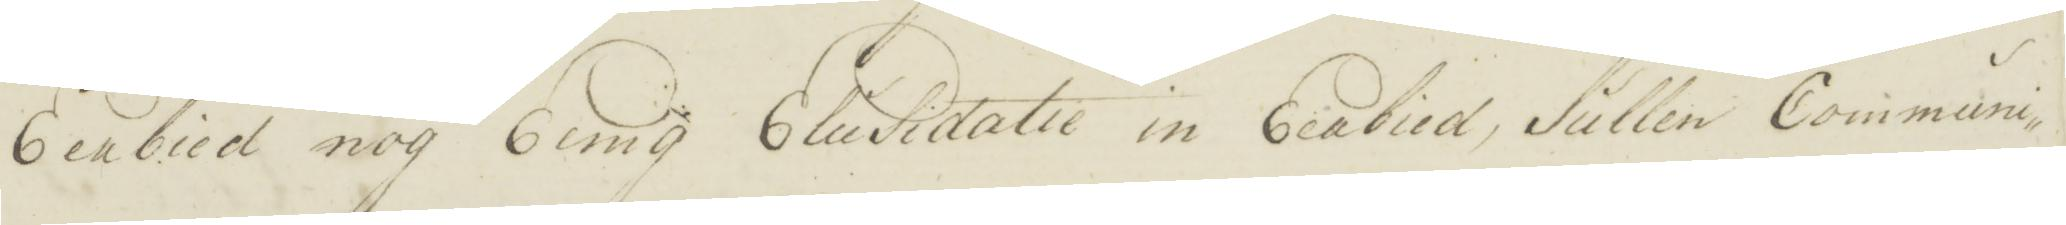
Eerbied nog Eenig Elusidatie in Eerbied, sullen Communi„
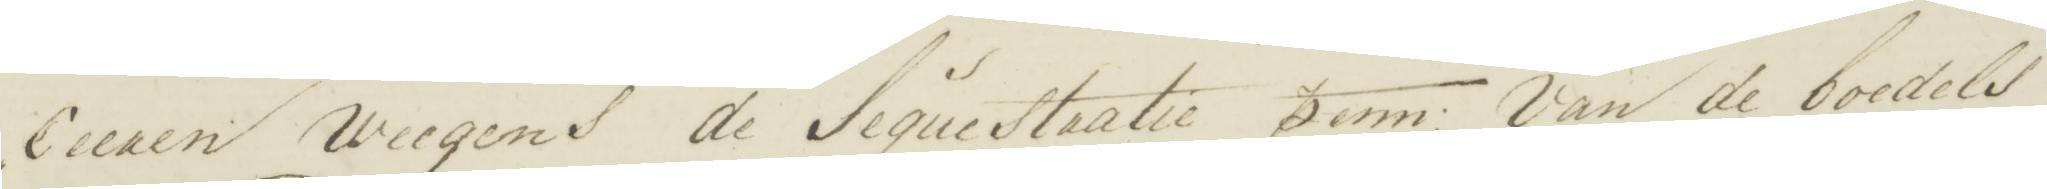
ceeren weegens de sequestratie penn: van de boedels
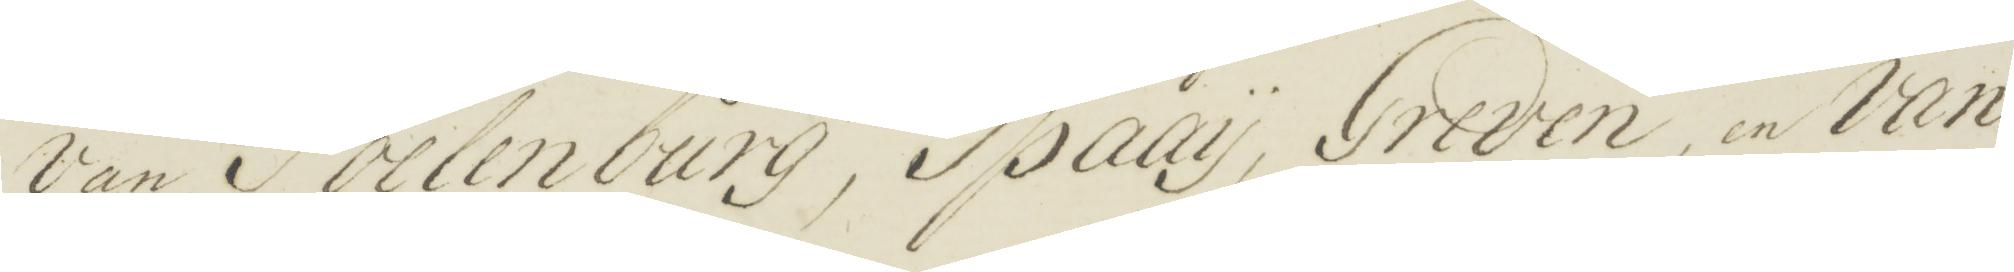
van Poelenburg, Spaaij, Greven, en van
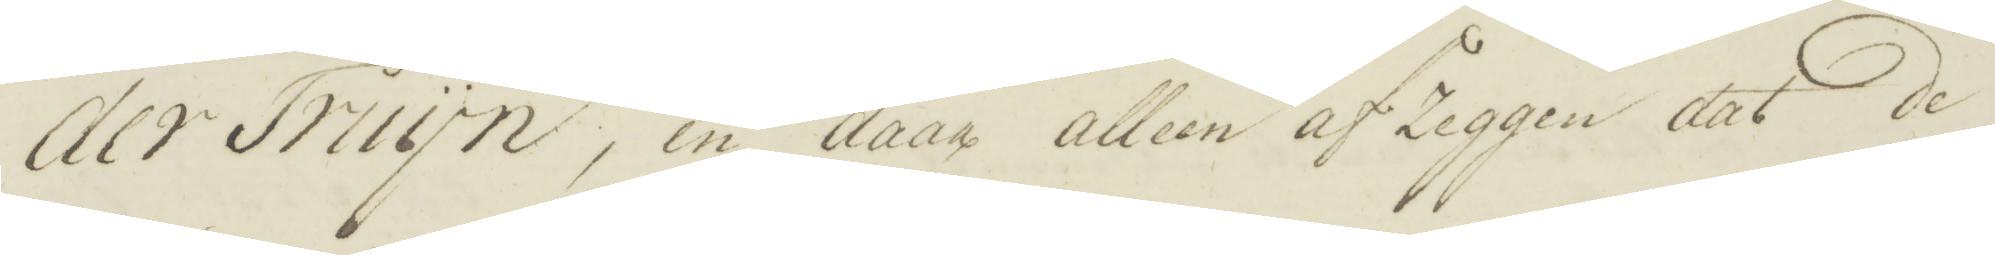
der Truijn, en daar alleen afzeggen dat de
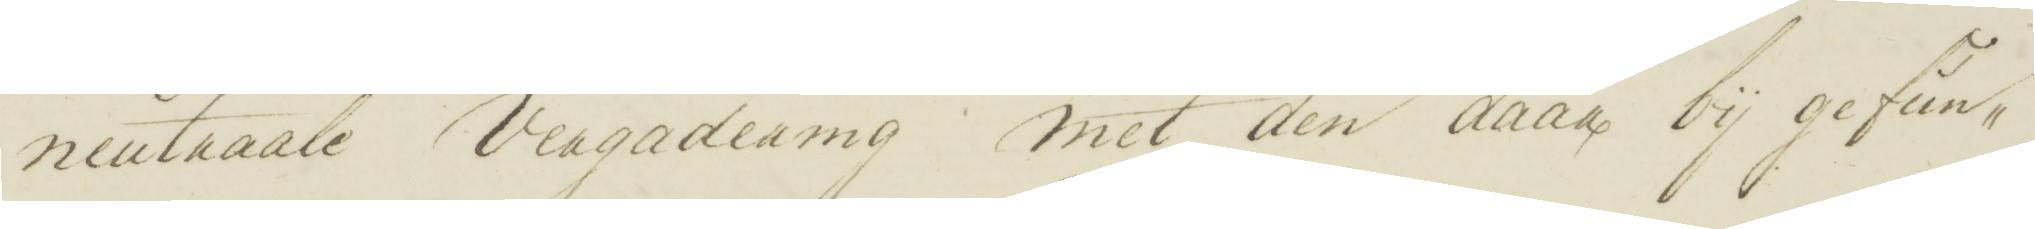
neutraale vergadering met den daar bij gefun„
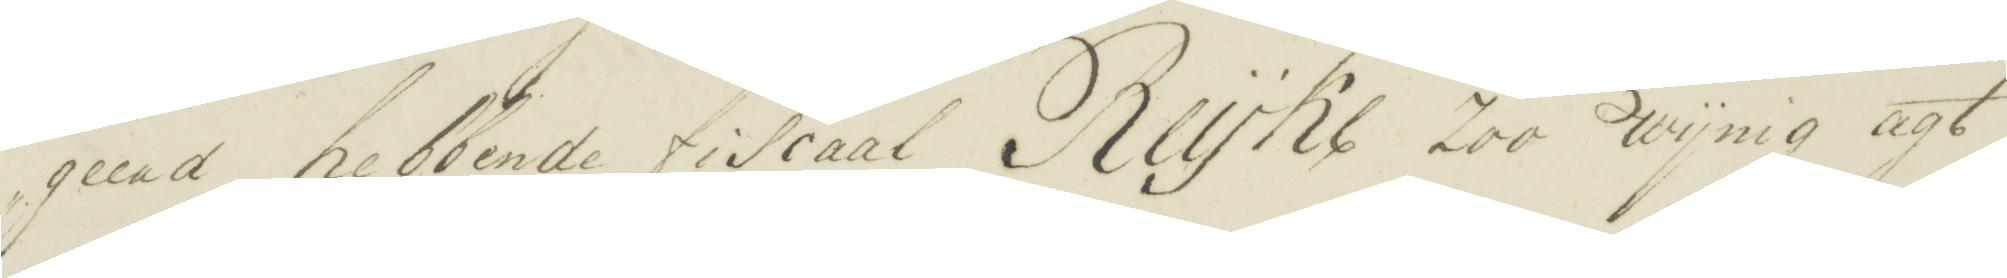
„geerd hebbende fiscaal Reijke zoo wijnig agt
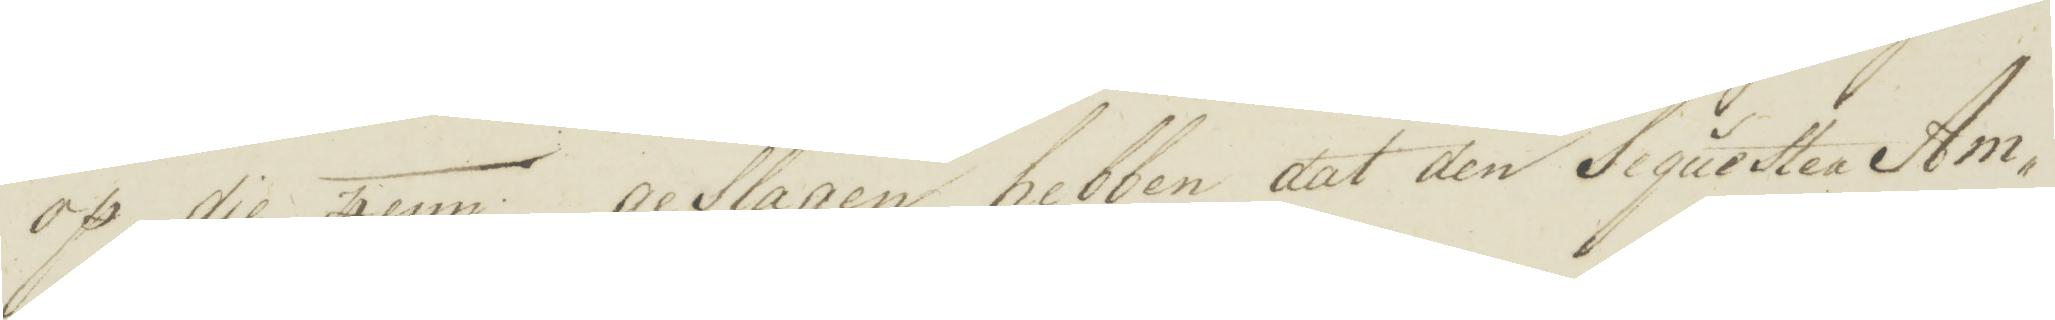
op die penn: geslagen hebben dat den sequester Am„
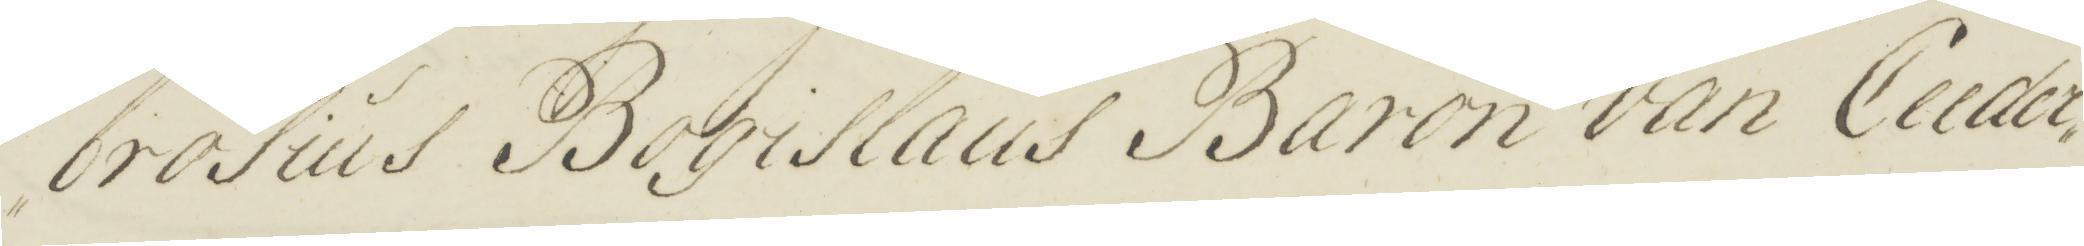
„brosius Bogislaus Baron van Ceeder„
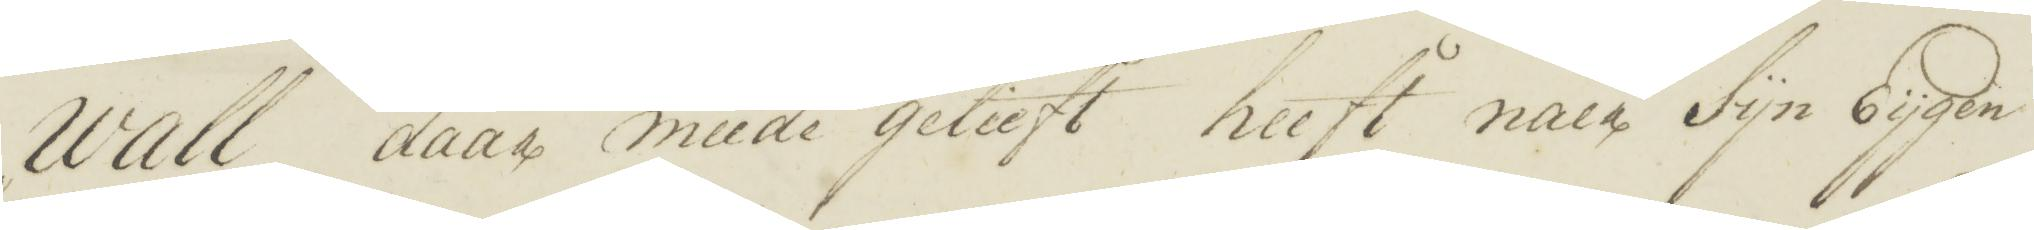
wall daar meede geleeft heeft naer sijn Eijgen
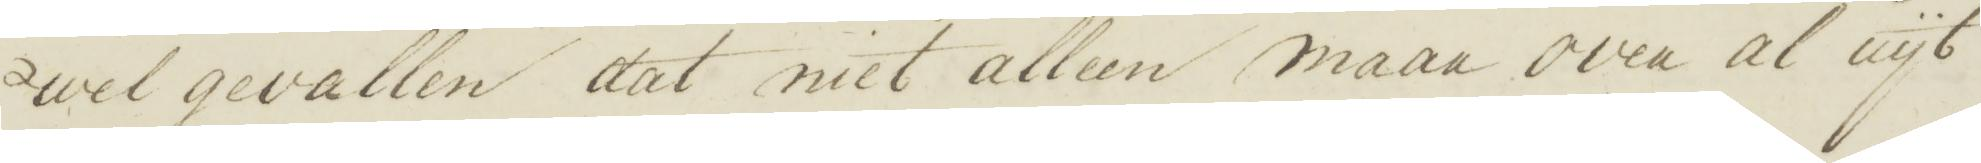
wel gevallen dat niet alleen maar over al uijt
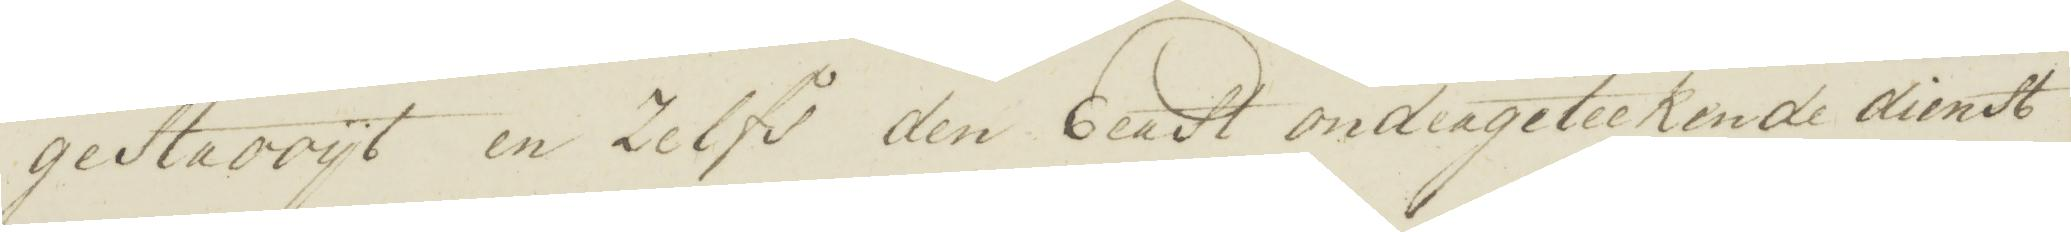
gestrooijt en zelfs den Eerst ondergeteekende dienst
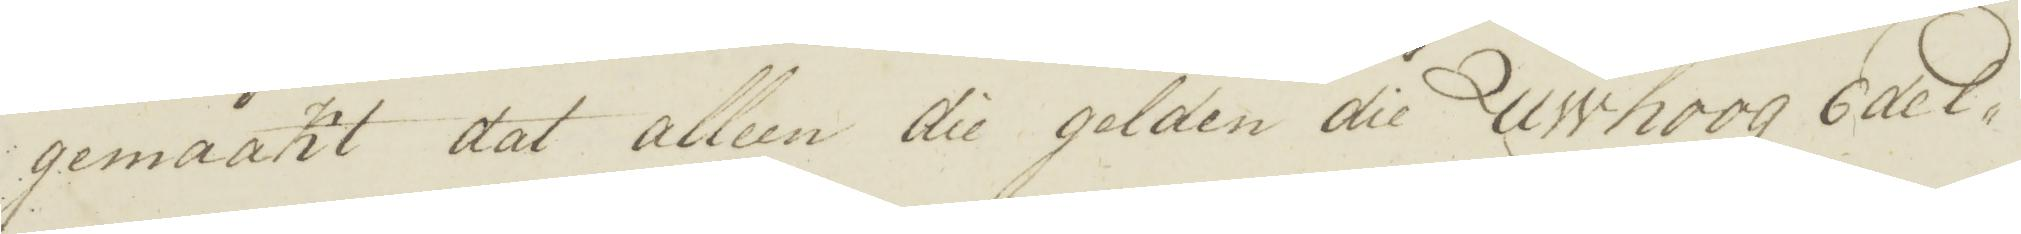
gemaakt dat alleen die gelden die uwhoog Edel„
